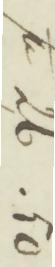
ƒ26.50
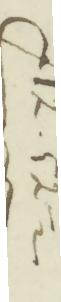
ƒ12.52½
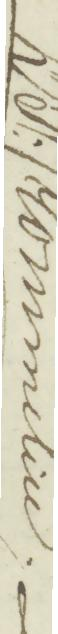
WFCrommelin
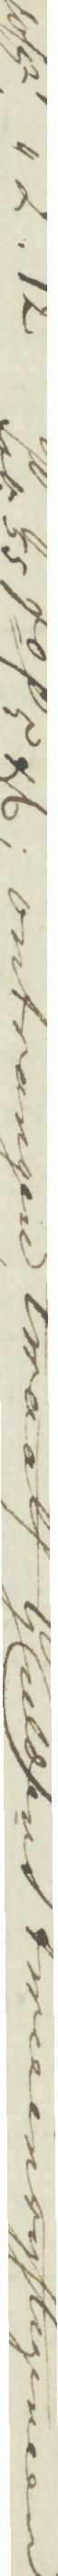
10/ct „ 2.13 fol.o. 55 V=o C 5 16; ontvangen twaalf Guldens tweeenvyftigeneen
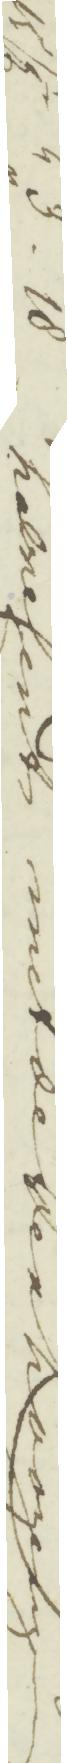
15/c-t „ 3.18. halve Cents met de verhooging
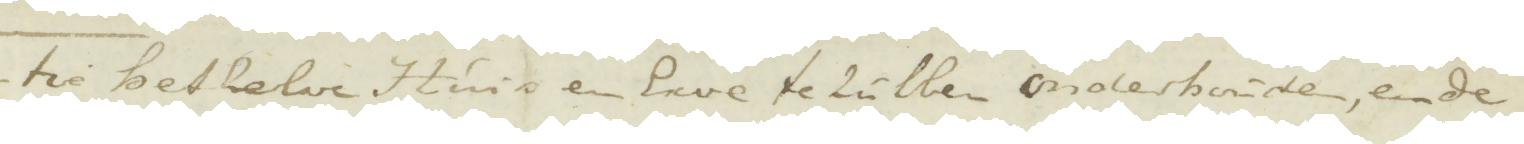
tie hetselve Huis en Erve te zullen onderhouden, en de
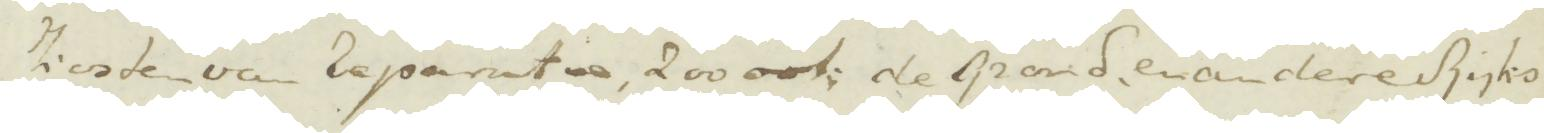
Kosten van reparatie, zoo ook de grond, en andere Rijks
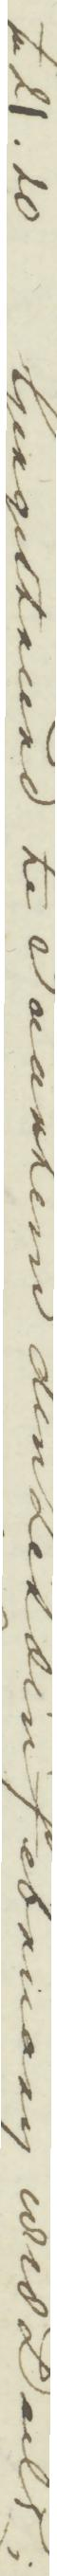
ƒ21.20 Gergistreerd te Haarlem den zesden february 1818 Deels;
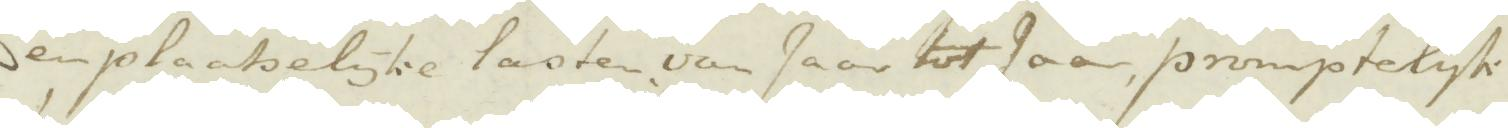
en plaatselijke lasten van Jaar tot Jaar, promptelyk
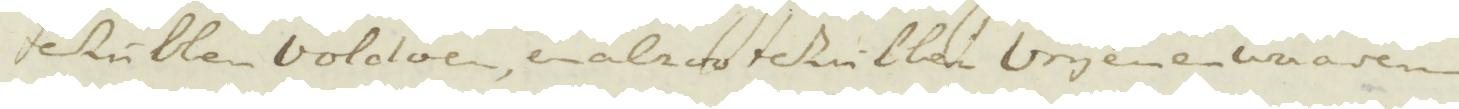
te zullen voldoen, en alzoo te zullen vrijen en waaren
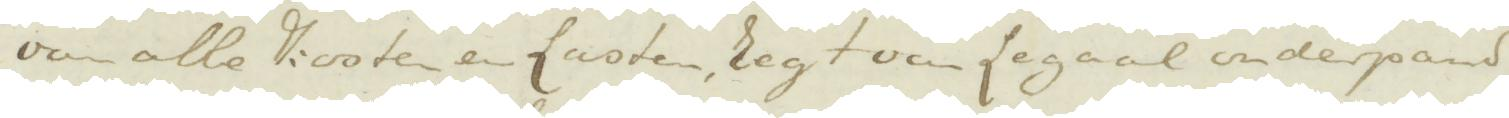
van alle Kosten en Lasten, Regt van Legaal onderpand
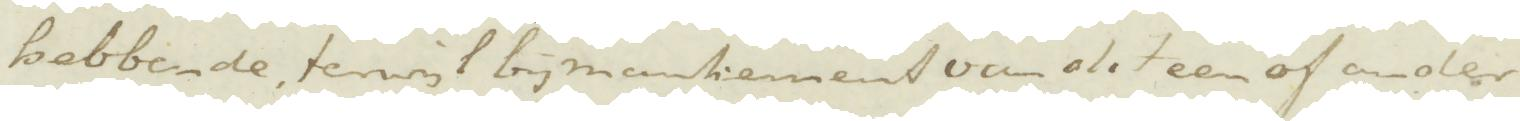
hebbende, terwijl bij mankement van dit een of ander
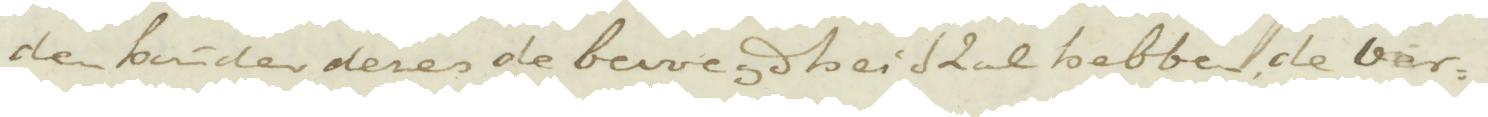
den houder dezes de bevoegdheid zal hebben, de ver„
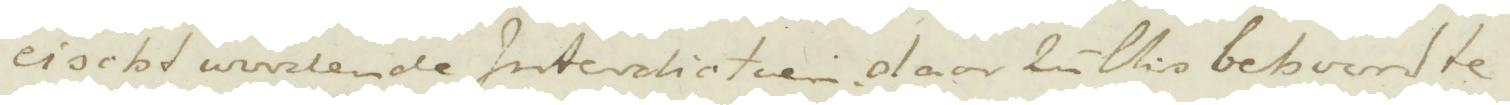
eischt wordende Jnterdictien, daar zulks behoort te
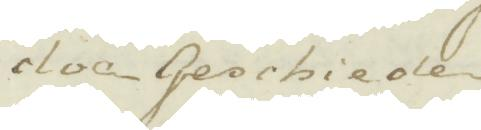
doen Geschieden
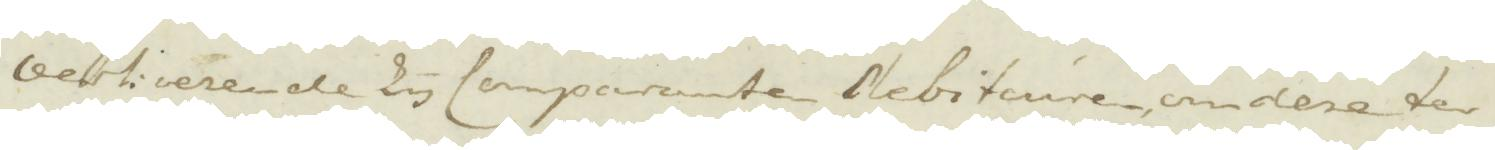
verkiezende zij Comparanten debiteuren, om deze ter
